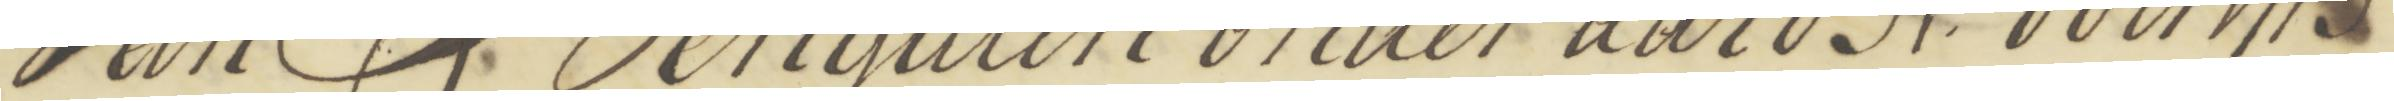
Van Bengalen onder dato 31:' 7ber 1713
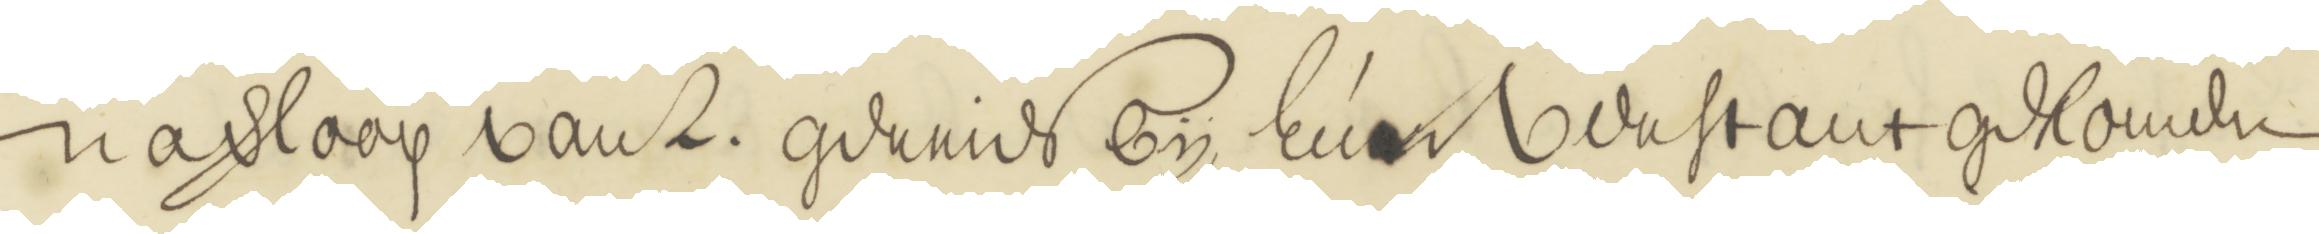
na verloop van 2. gerrief bij hun verstant gekomen
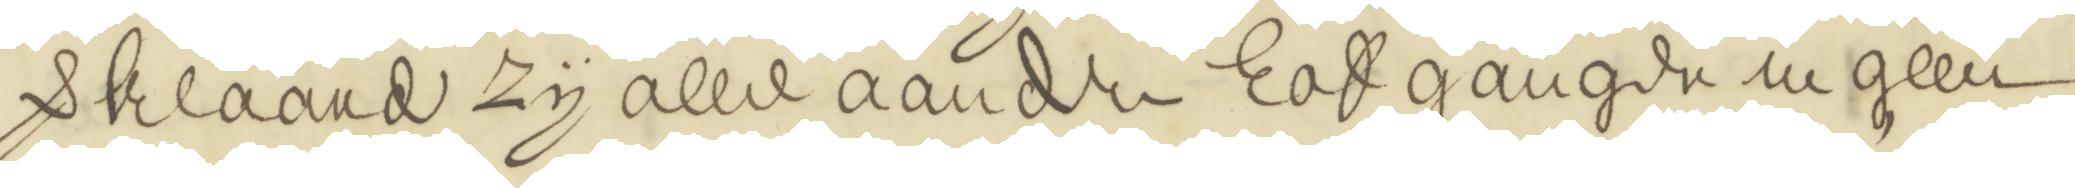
verklaarde zij alle aan den hof ganger in geen
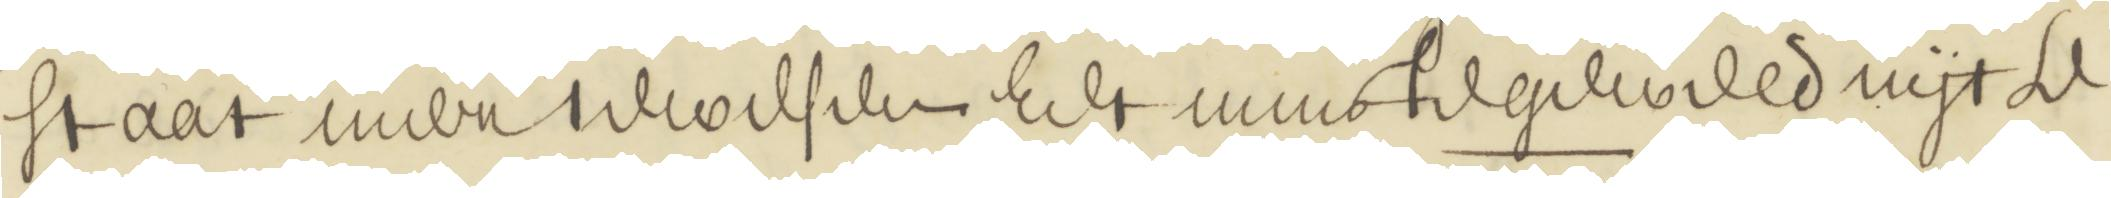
staat meer tewesen het minste geweld uijt te
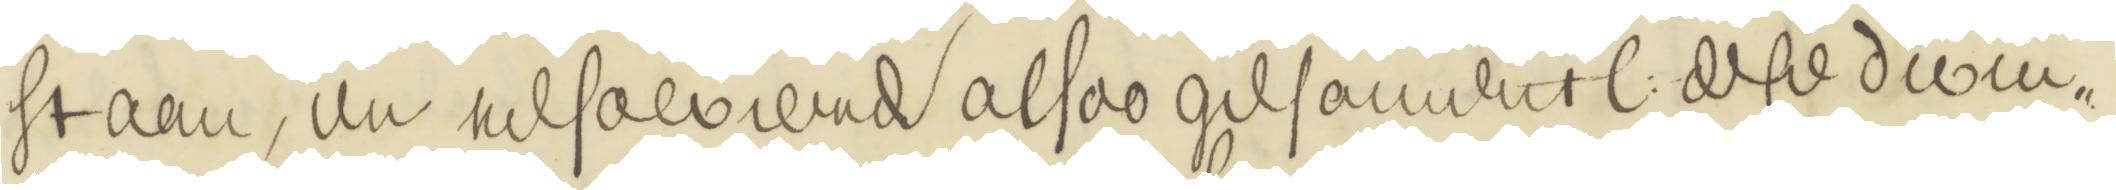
staan, en resolveerde alsoo gesamentl: dese dwin„
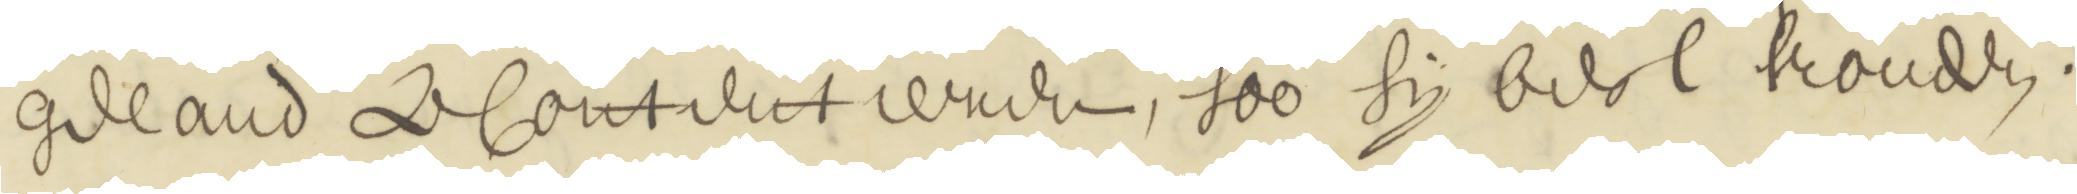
geland te Contenteeren, soo sij best konden
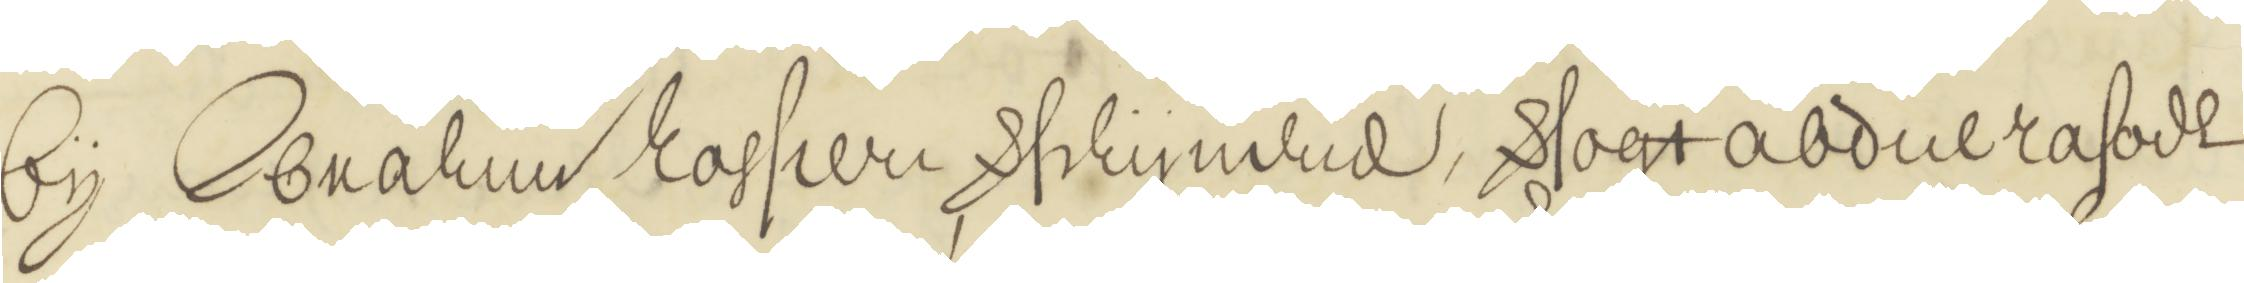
bij Ibrahim Hossieri verschijnende, versogt abdul rasoel
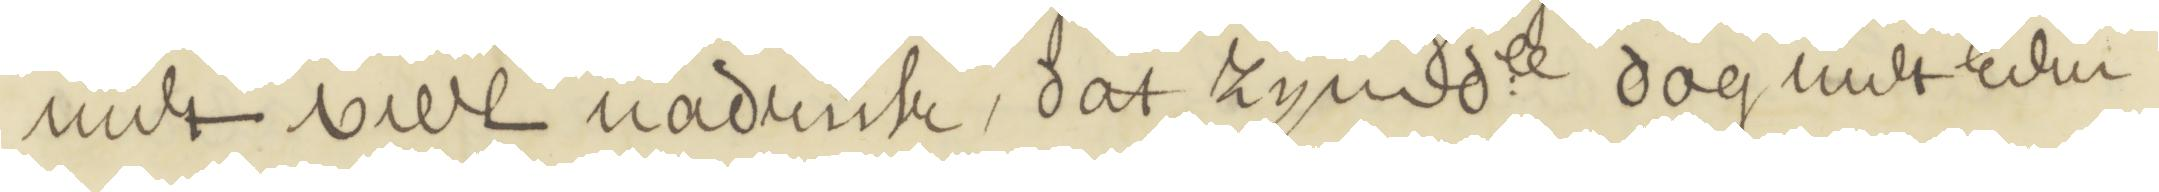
met veel nadruk, dat zyn Ed:le dog met hem
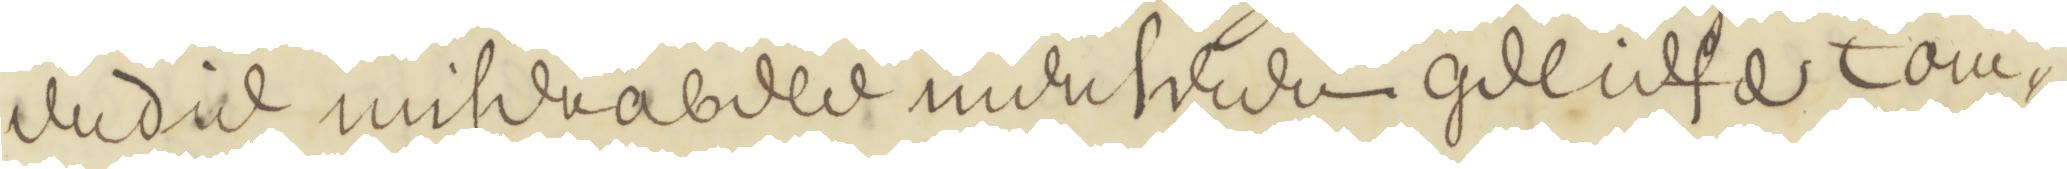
en die miserabele menschen geliefde com„
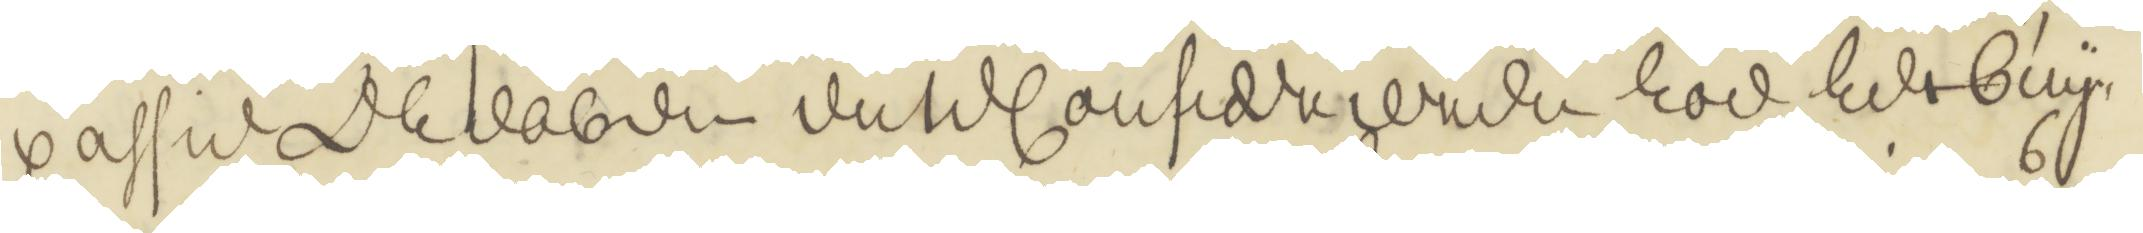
passie te hebben en te Considereren hoe het buij„
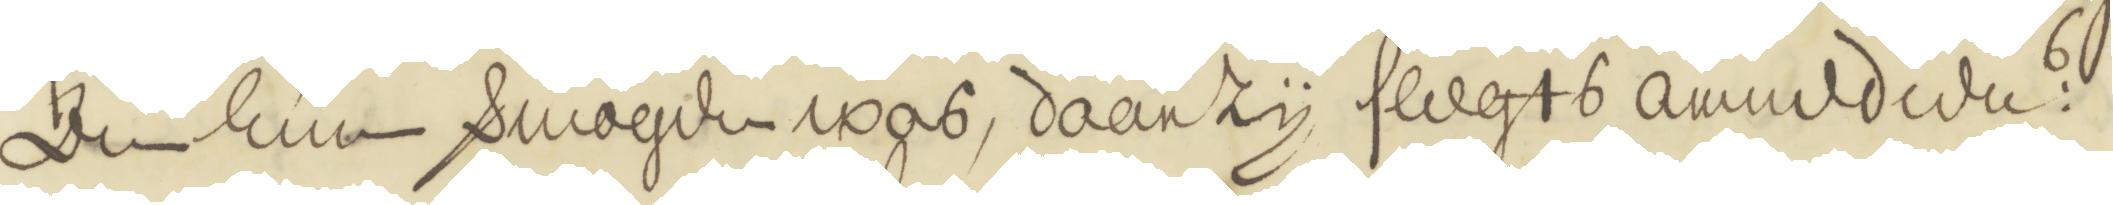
ten hun vermogen was, daar zij slegts armedien:s
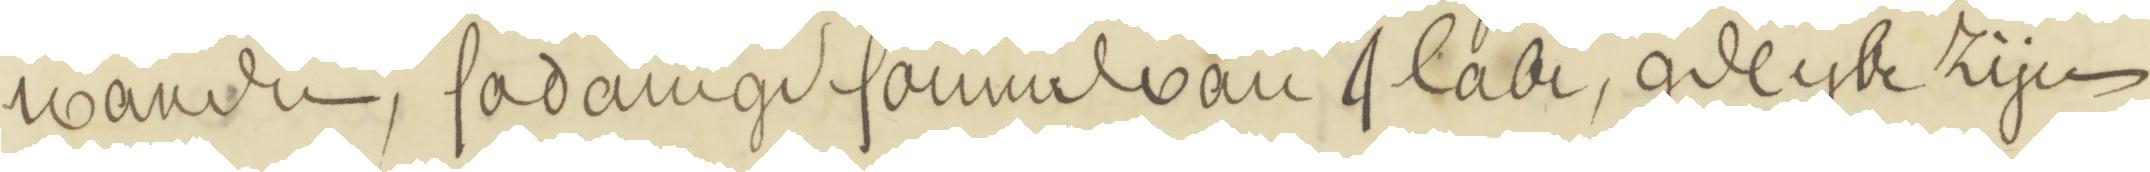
waren, sodanige somme van 4 lak, gelyk zijn
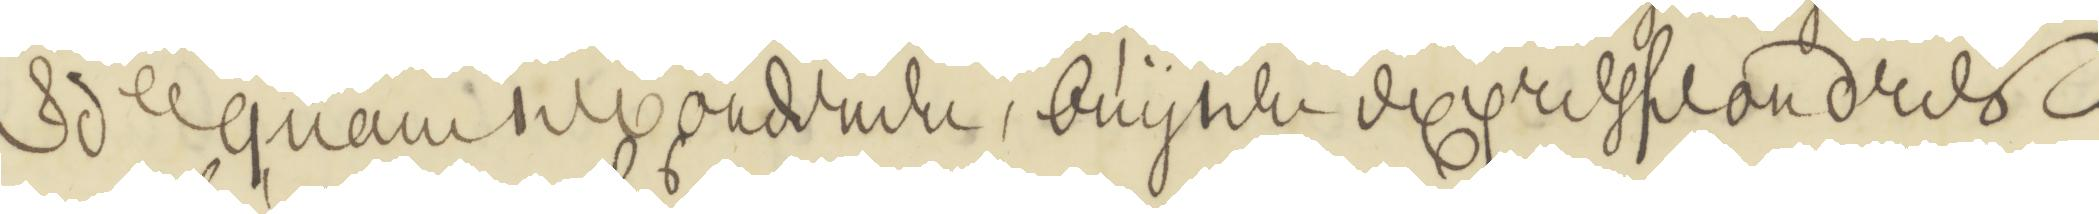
Edle quam te vorderen, buijten expresse ordres
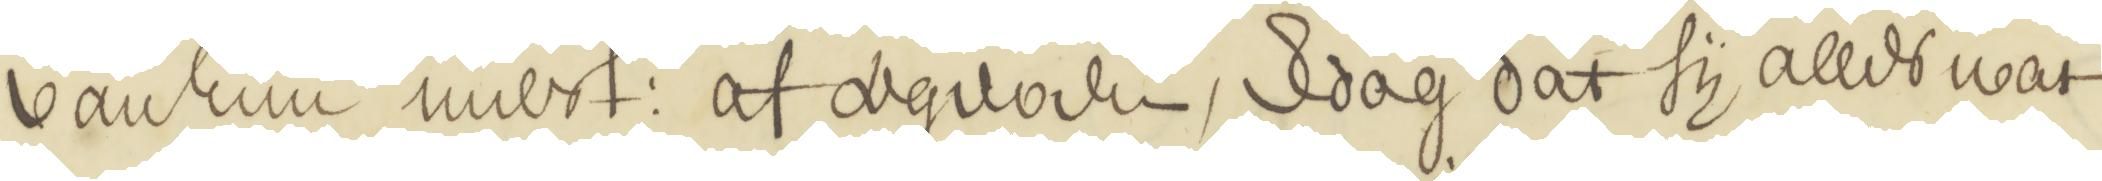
van hun meest:s af tegeven, Edog dat sij alles wat
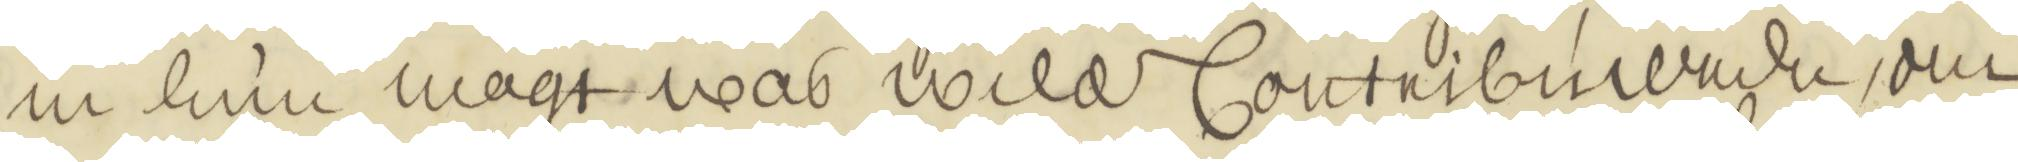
in hun magt was wilde Contribueeren, om
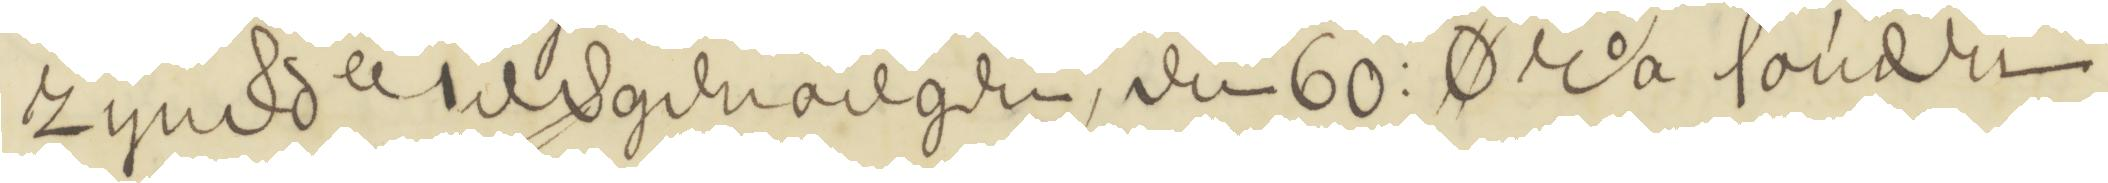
zyn Edle tevergenoegen, en 60: Oroa souden
